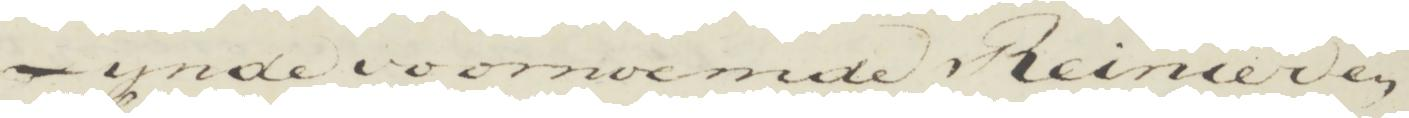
zynde voornoemde Reinier en
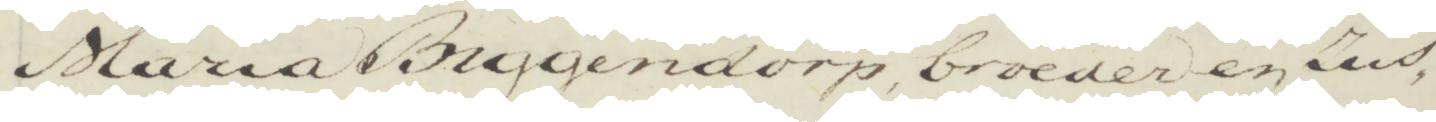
Maria Biggendorp, broeder en zus„
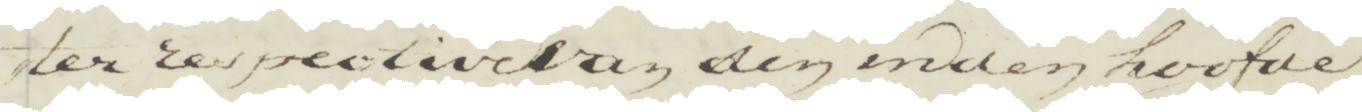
„ter respective van den in den hoofde
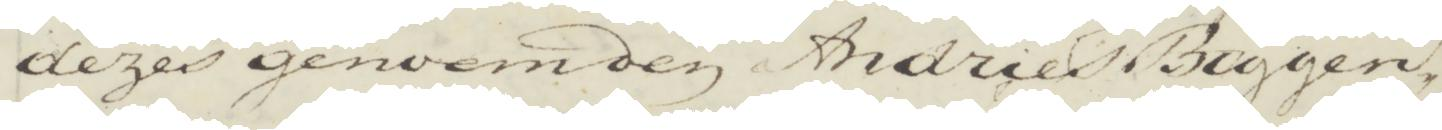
dezes genoemden Andries Biggen„
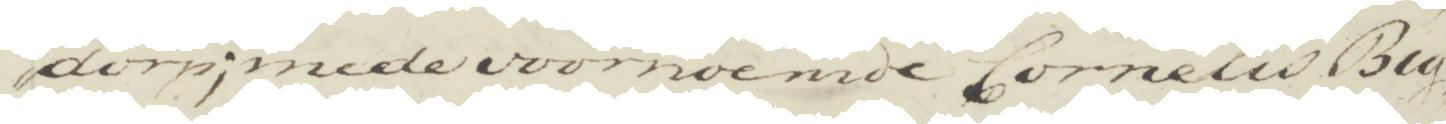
„dorp; mede voornoemde Cornelis Big
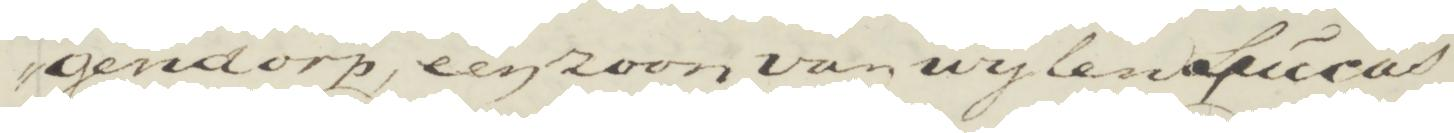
„gendorp, een zoon van wylen Lucas
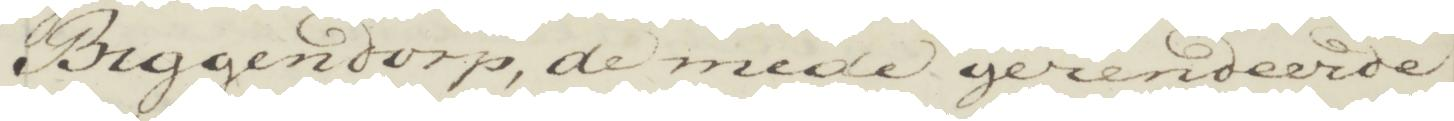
Biggendorp, de mede gerendeerde
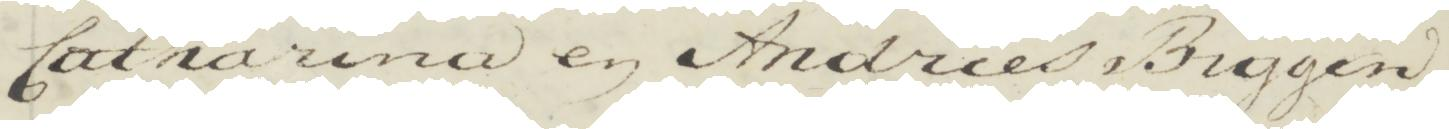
Catharina en Andries Biggen
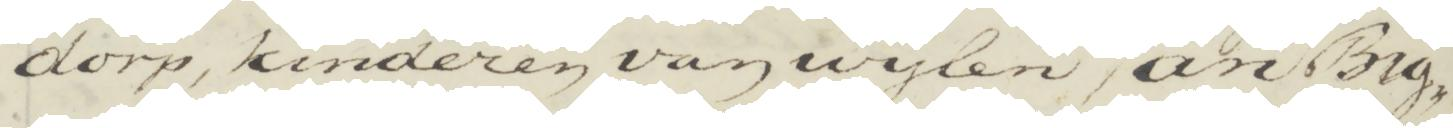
dorp, kinderen van wylen Jan Big„
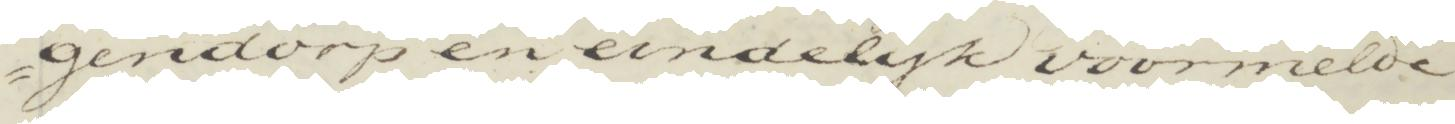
=gendorp en eindelyk voormelde
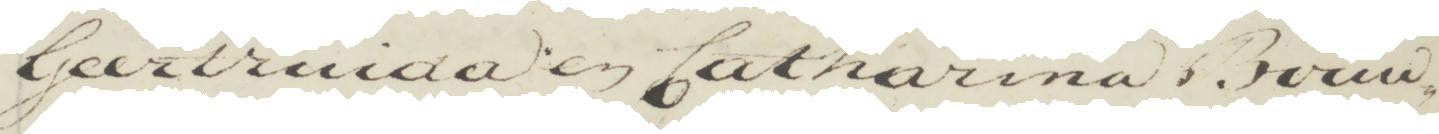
Geertruida en Catharina Bouw„
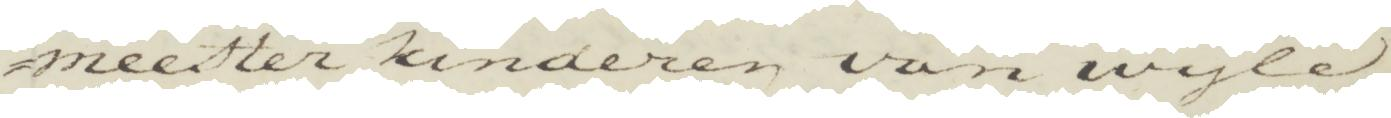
=meester kinderen van wyle
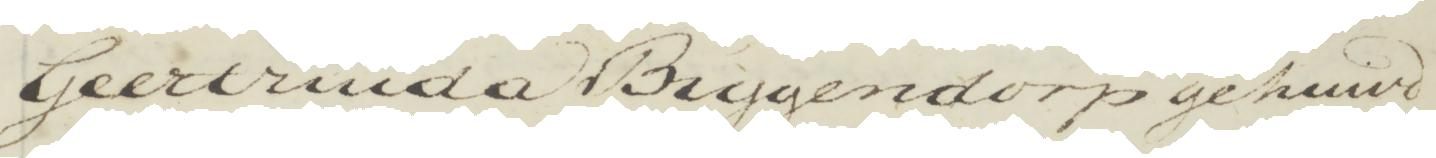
Geertruida Biggendorp gehuwd
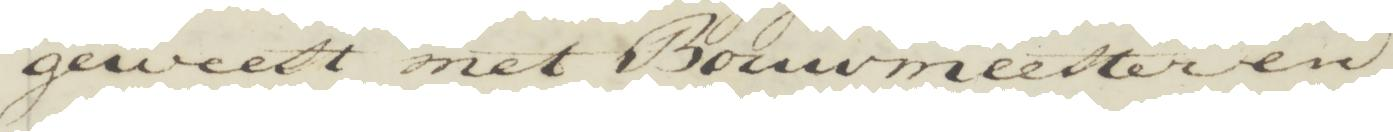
geweest met Bouwmeester en
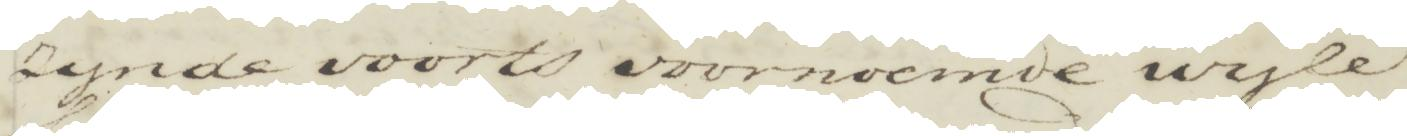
zynde voorts voornoemde wyle
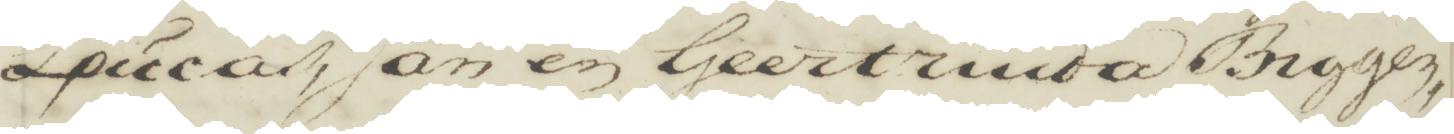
Lucas, Jan en Geertruida Biggen„
